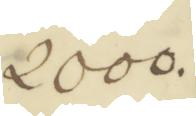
2000.
